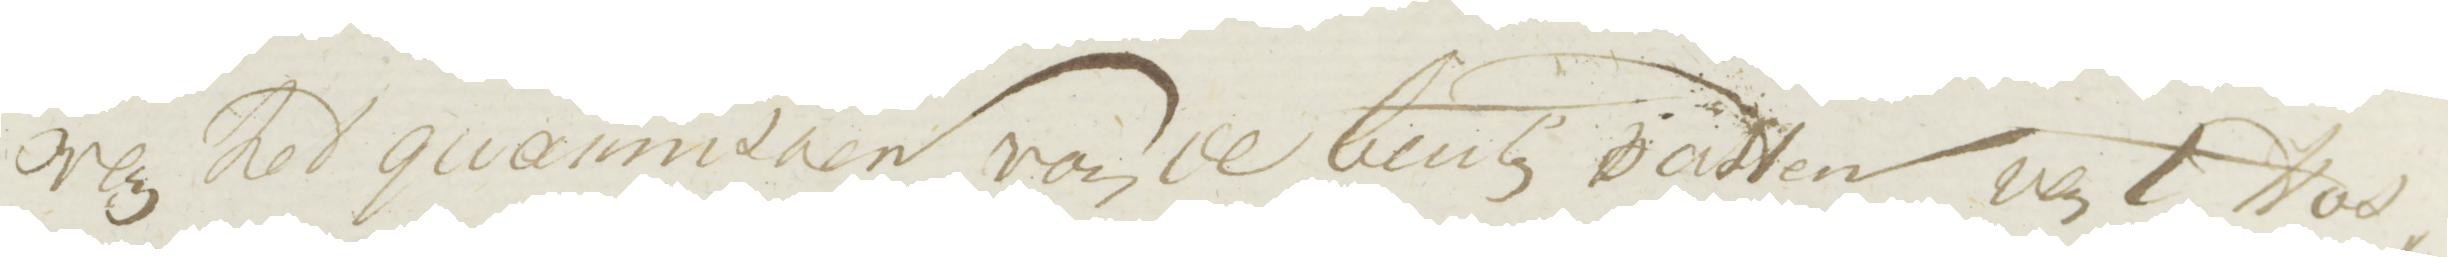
van het quarnisoen van de buiten passen van ’t Hos„
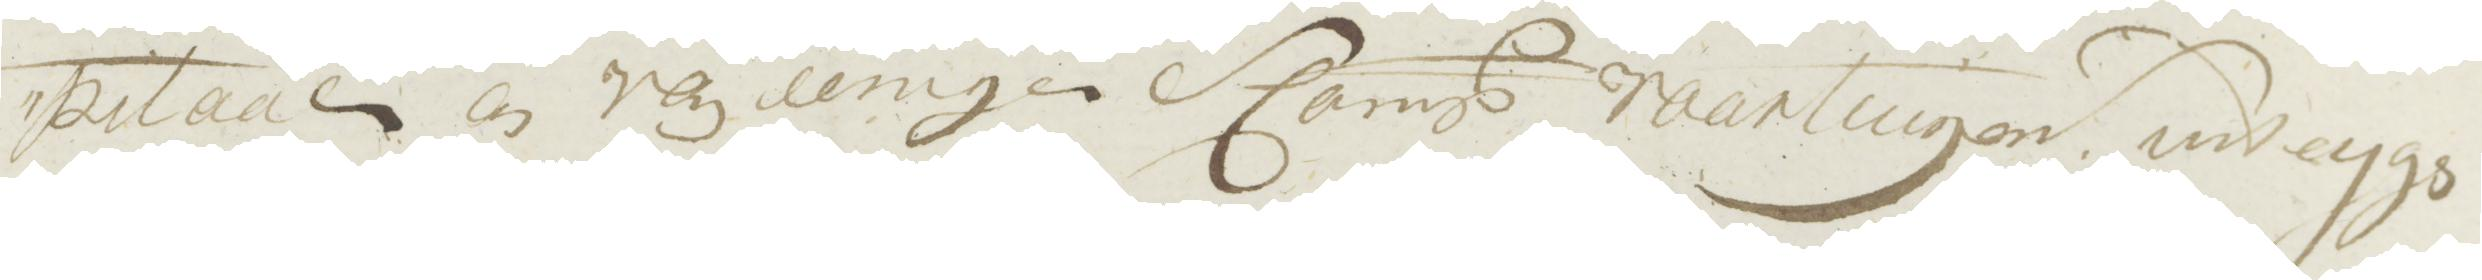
„pitaal en van eenige SComp:s vaartuigen. uit eygen
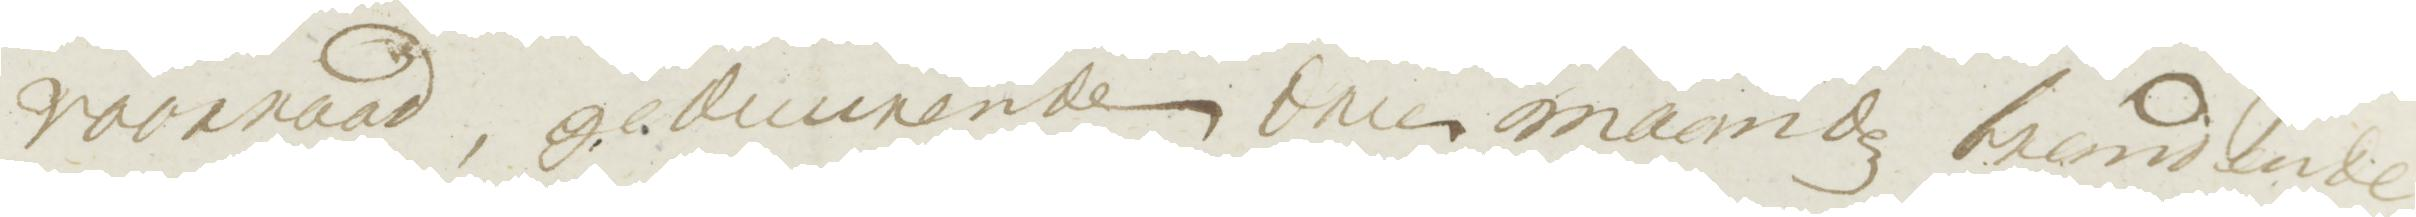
voorraad, geduurende drie maanden brandende
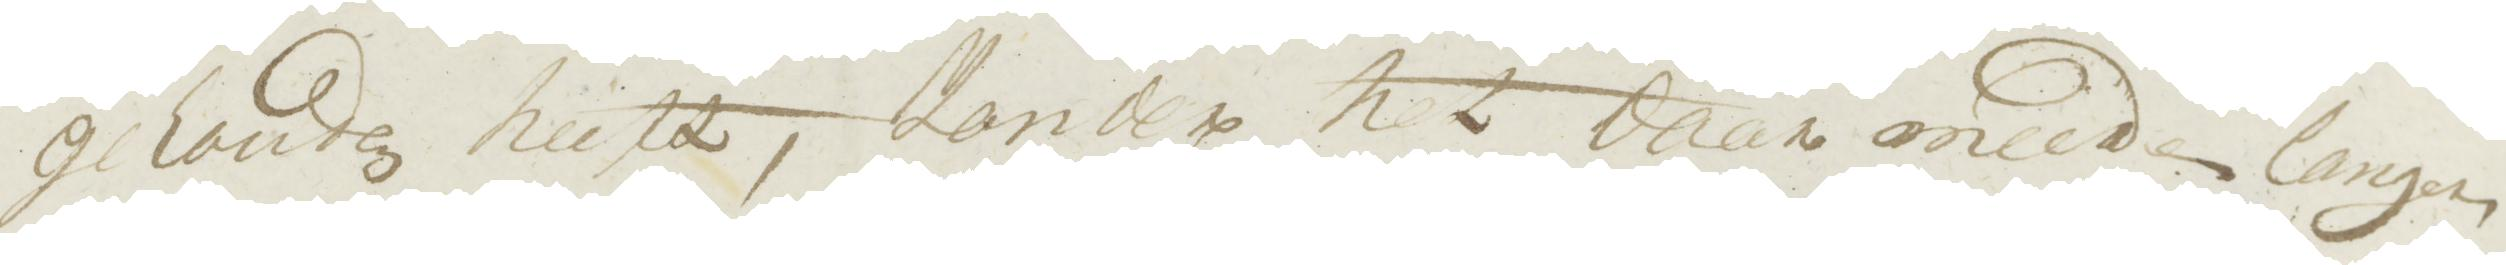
gehouden heeft, Zonder het daar meede langer
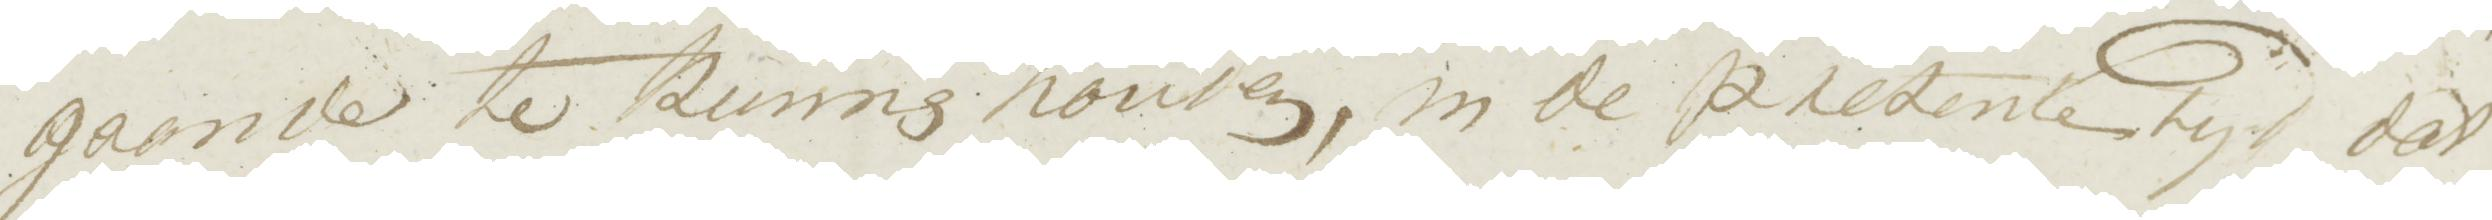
gaande te kunnen houden, in de presente tyd dat
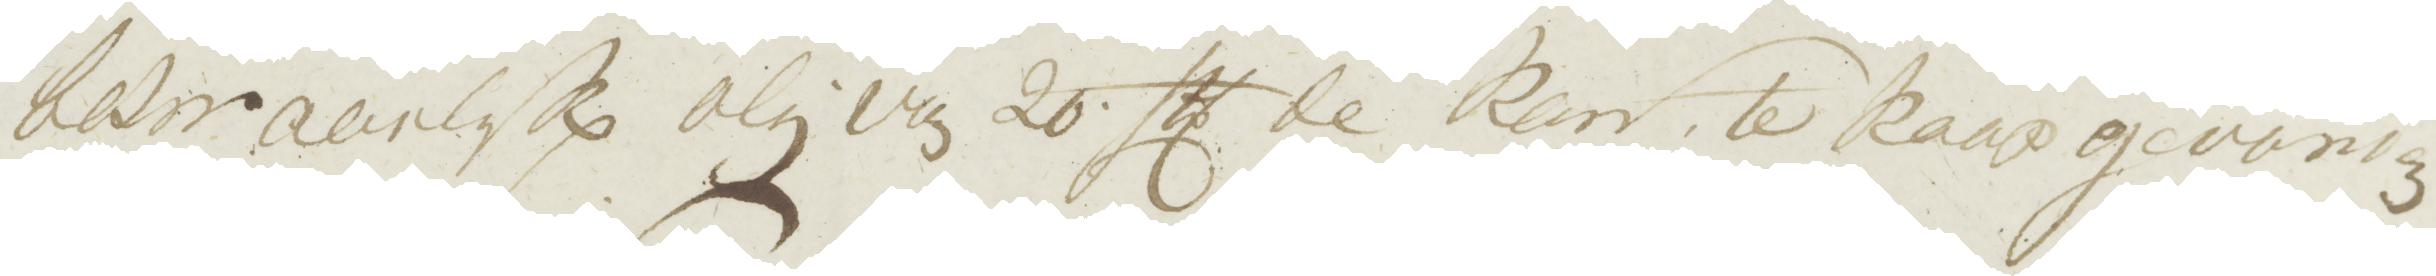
beswaarlyk oly van 26. stx de kan, te koop gevonden
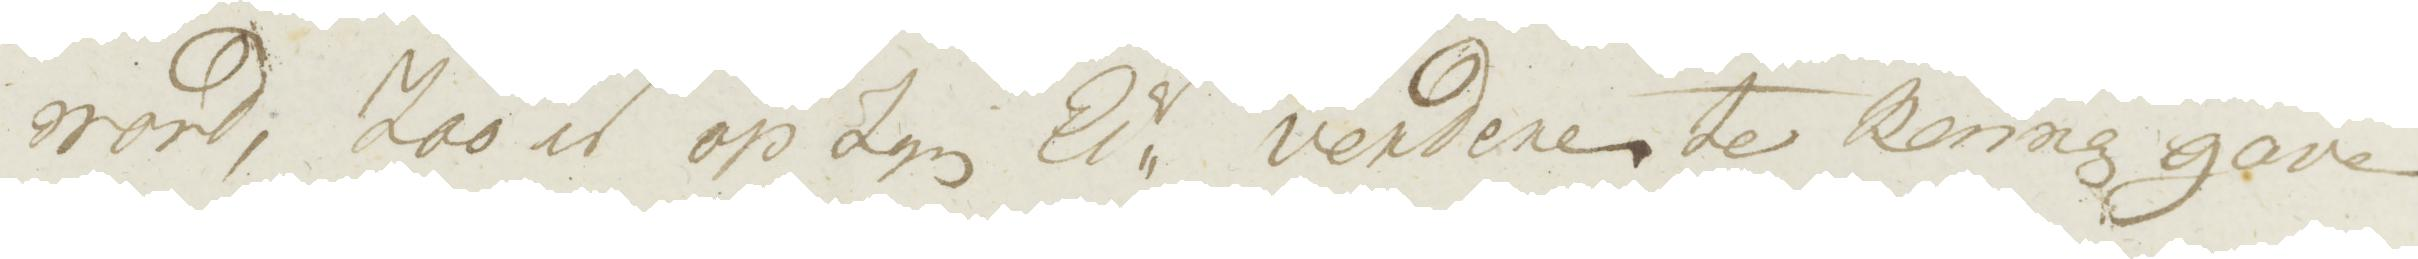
word; Zoo is op Zyn Ed„' verdere te kennen gave
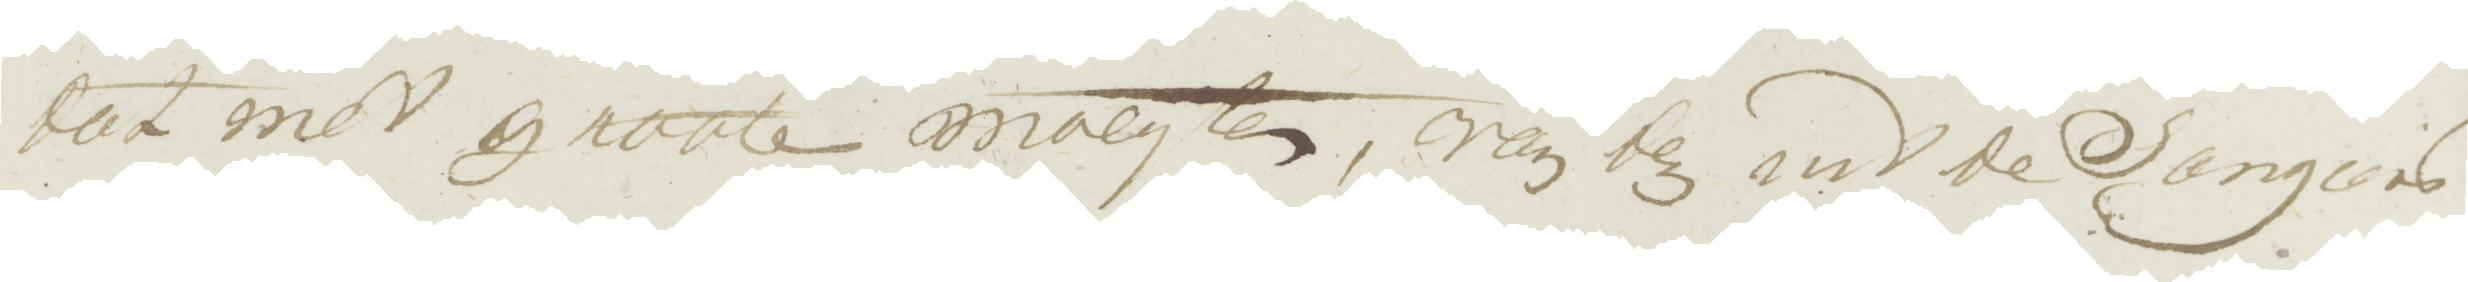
dat met groote moeyte, van den int de Sangiers
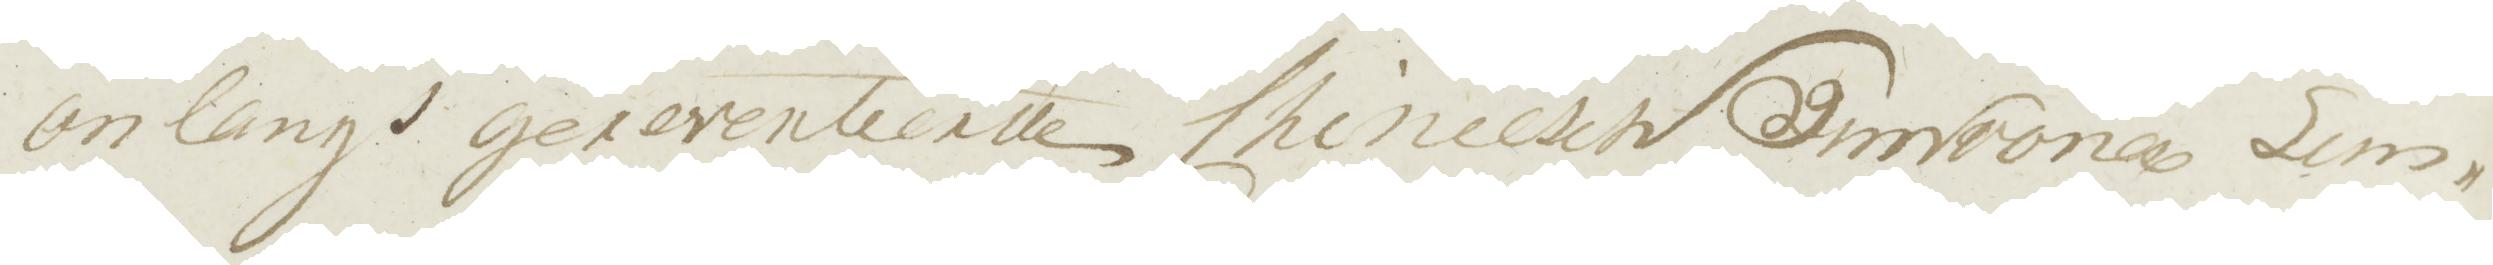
onlangs gereventeerde Chineesch Inwoona Lim„
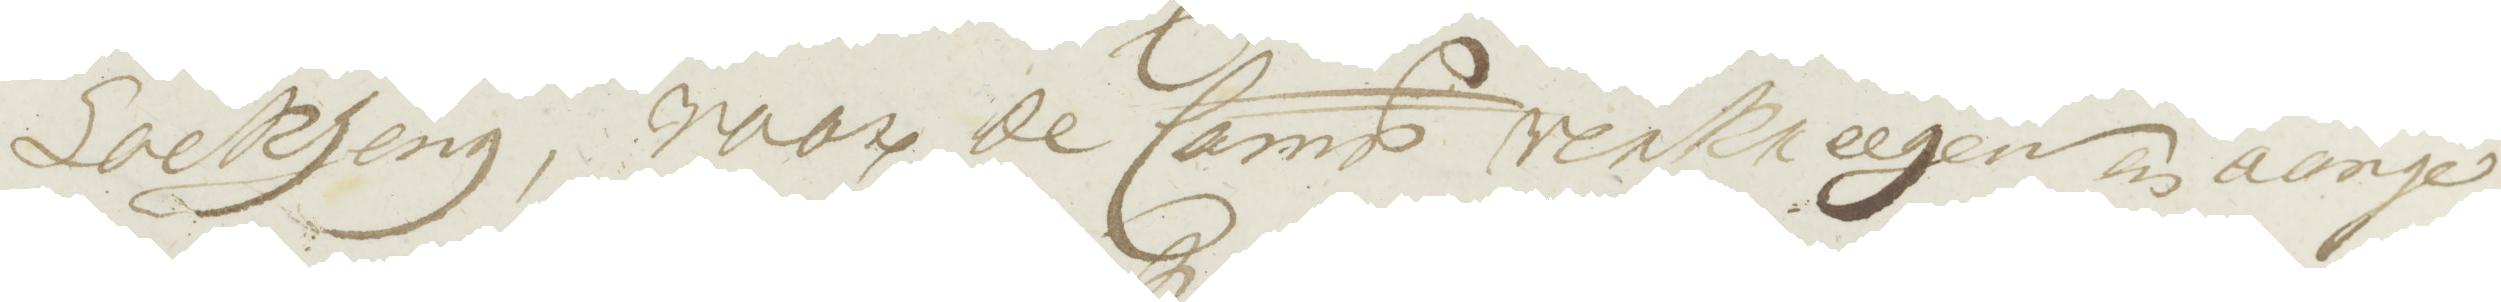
Loescheng, voor de Comp: verkreegen en aange,
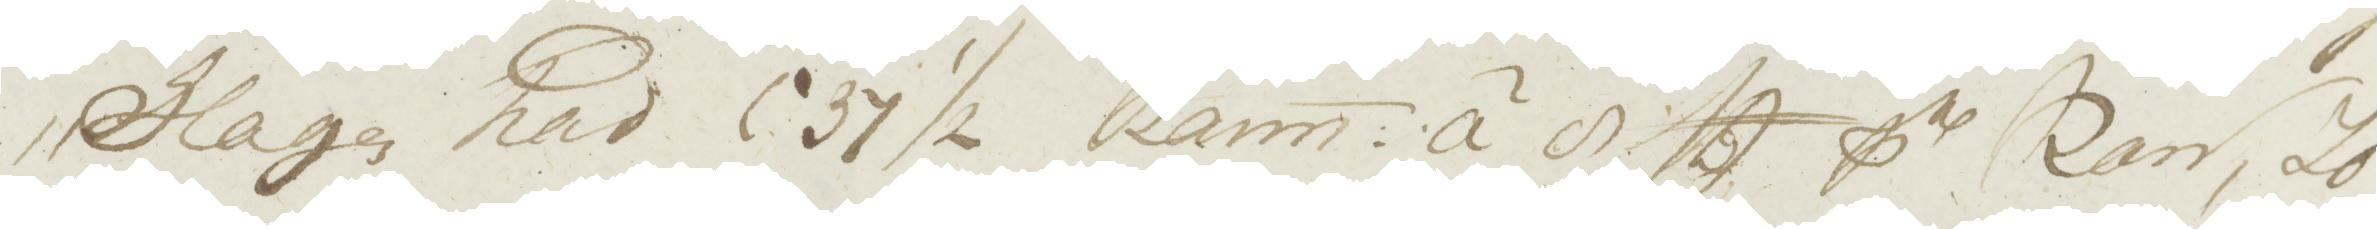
„Slagen had 537½ kann: â 8: stx p:r Kan, Zo
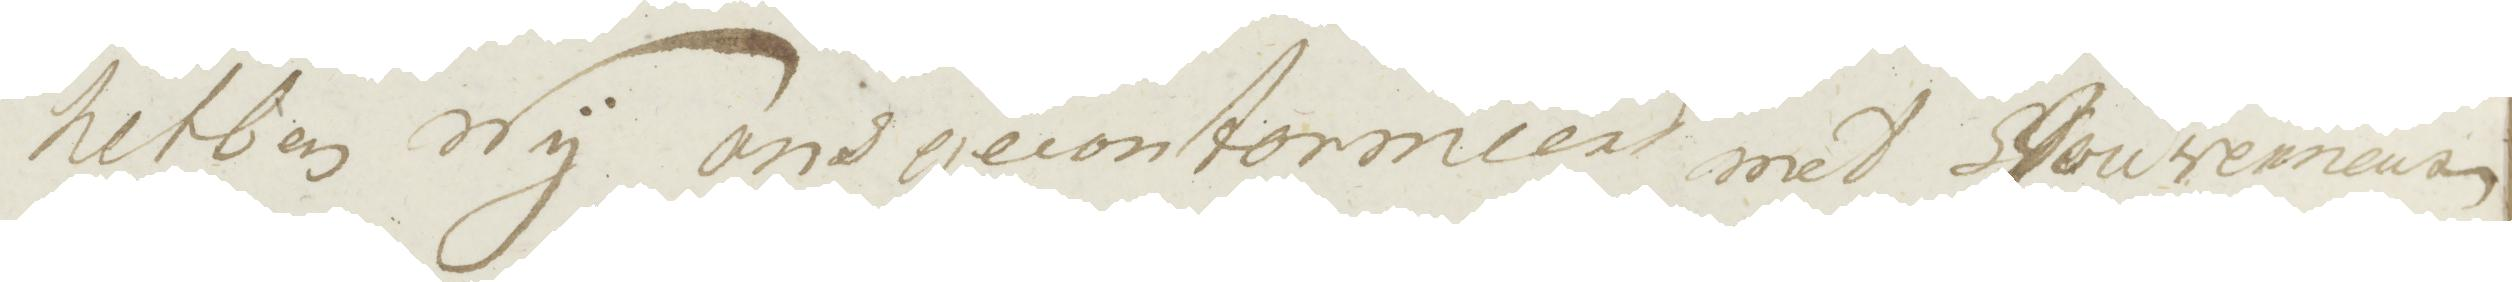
hebben wij ons geronformeerd met dGouverneur
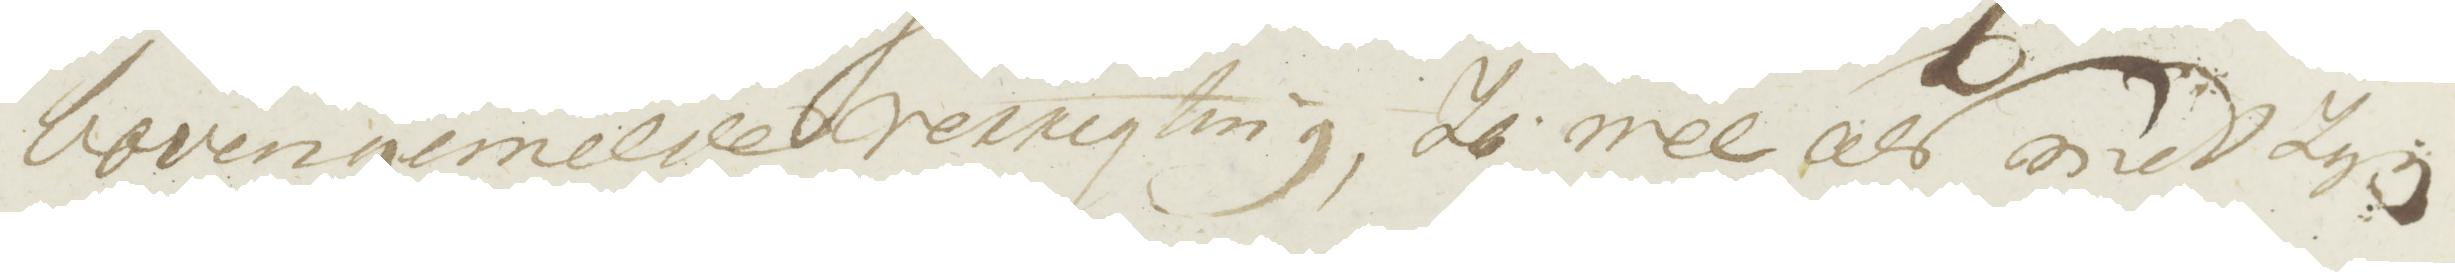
bovengemelde verrigting, Zo wel als met Zyn
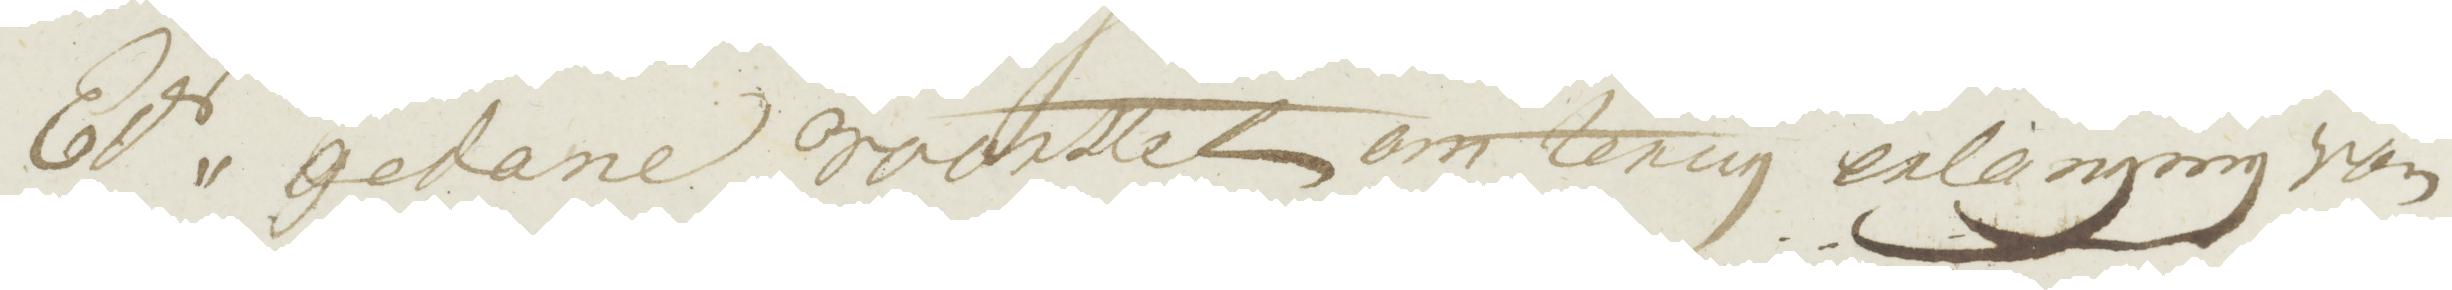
Ed„s gedane voorstel om terug erlanging van
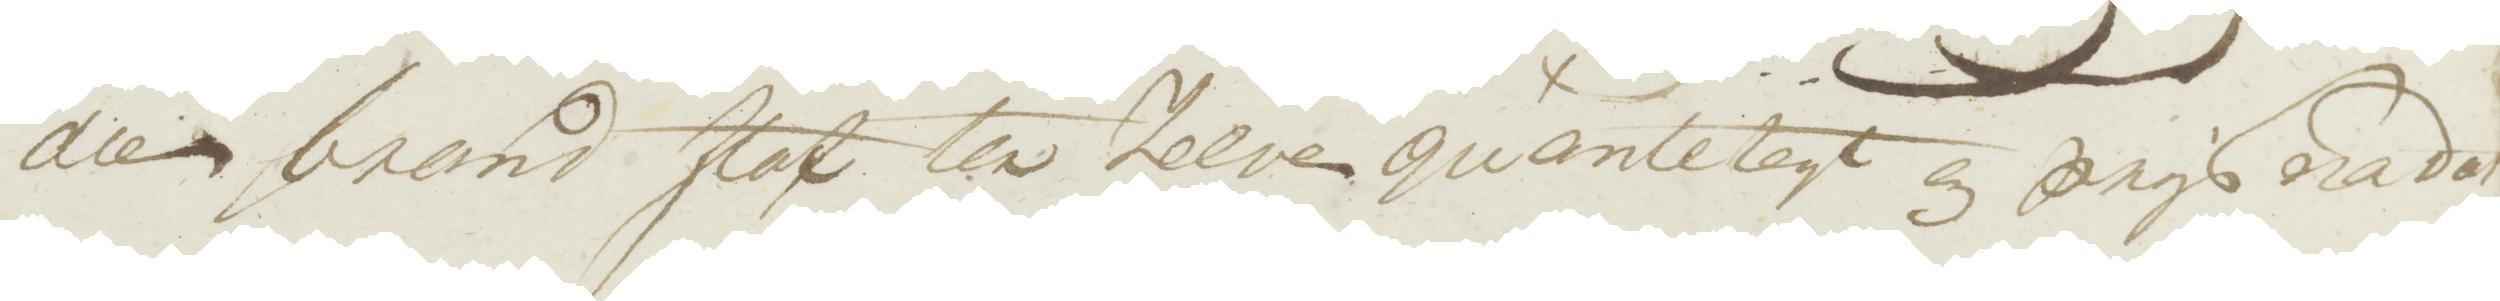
die brandstof ter Zelve quanteteyt en prijs nadat
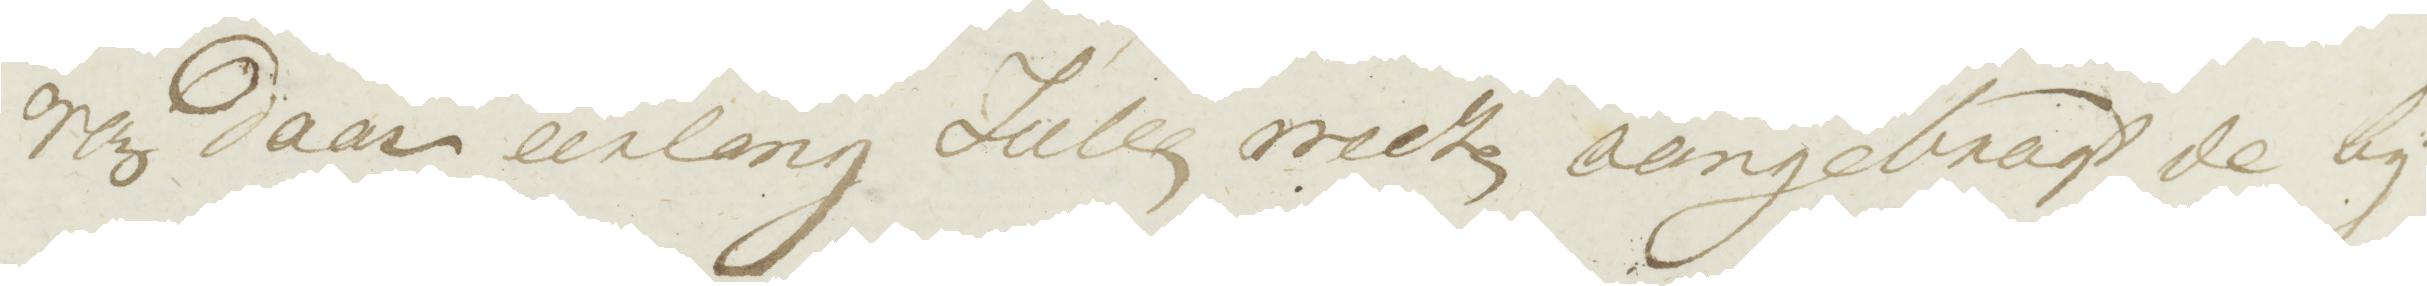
van daar eerlang Zullen weezen aangebragt de bij
